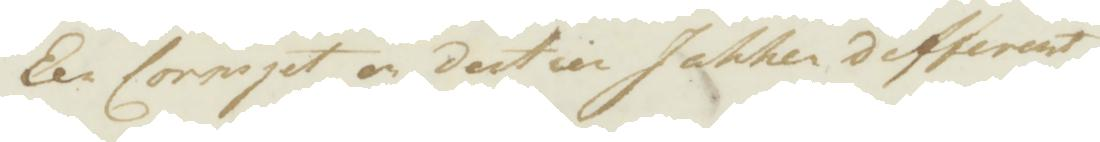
Een corrsjet, en dertien Jakken different,
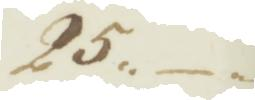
25 „ — „
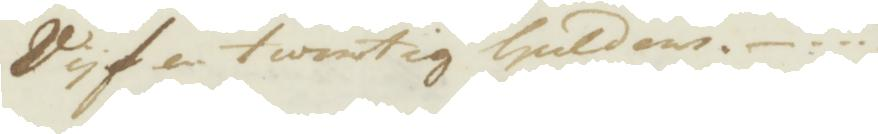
Vijf en twintig Guldens.— - - -
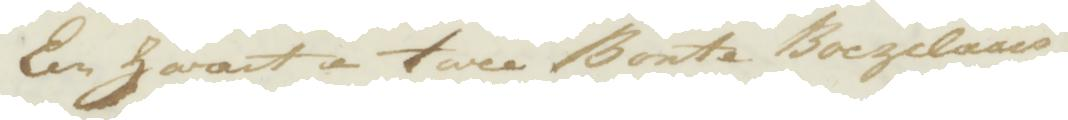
Een zwart en twee Bonte Boezelaars,
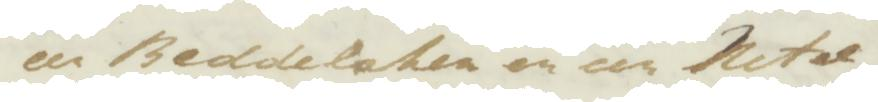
een Beddelaken en een Netel,
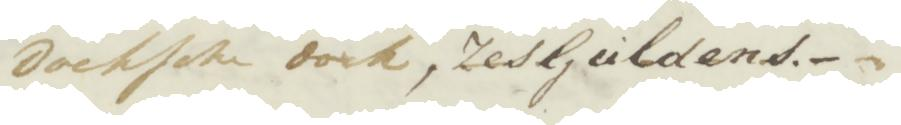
doeksche doek, Zes Guldens.—
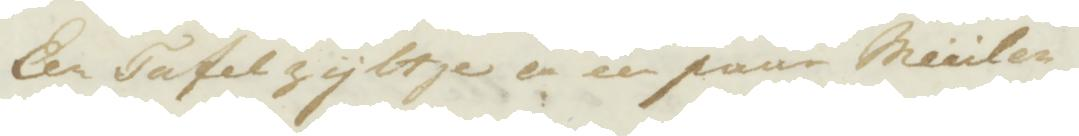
Een Tafelzijltje en een paar Muilen
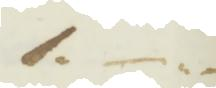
1„ — „ -
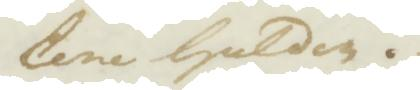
Eene Gulden.
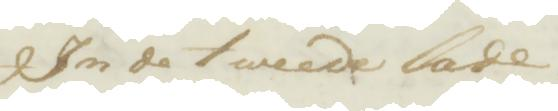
In de tweede lade
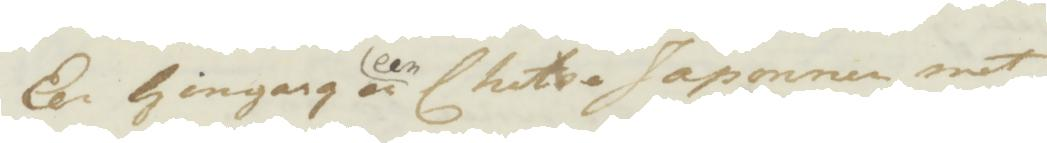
Een Gingang en een Chitse Japonnen, met
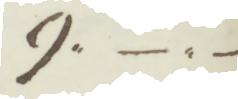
9„ — „ —
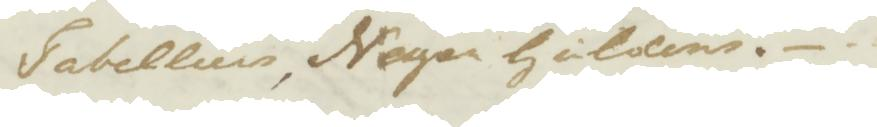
Tabelliers, Negen Guldens. — „
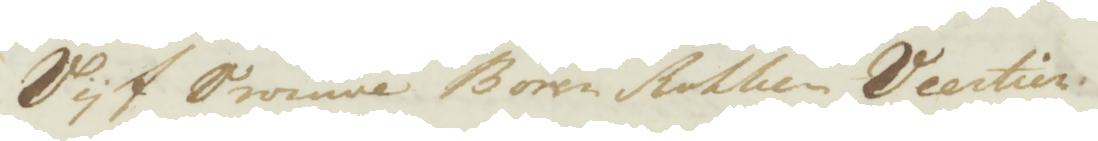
Vijf Vrouwe Boven Rokken, Veertien „
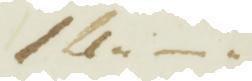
14„ — „
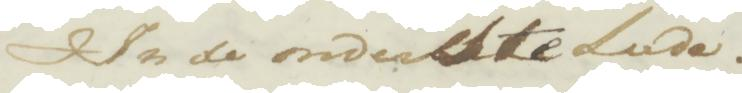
In de onderste lade
